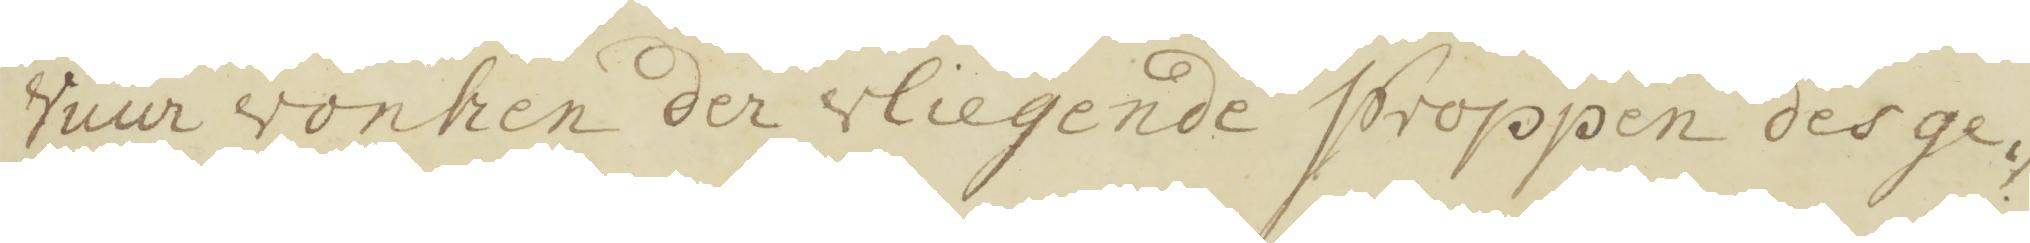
Vuur vonken der vliegende proppen des ge„
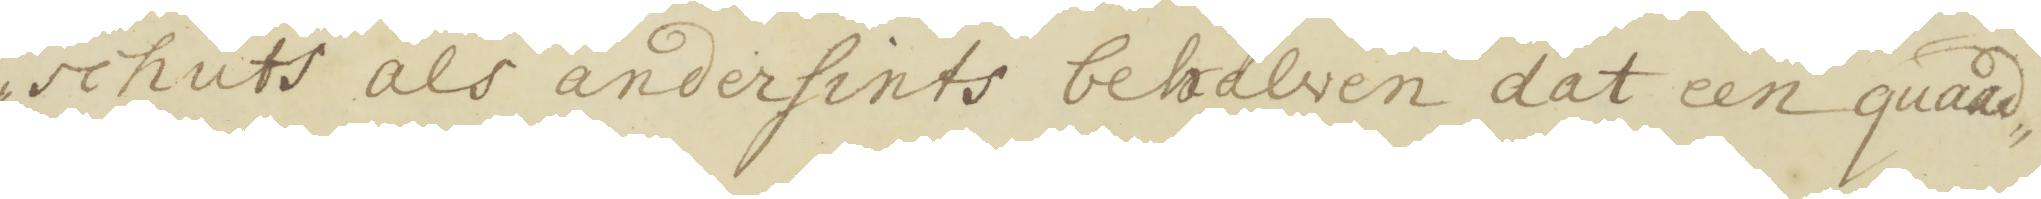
„schuts als andersints behalven dat een quaad,
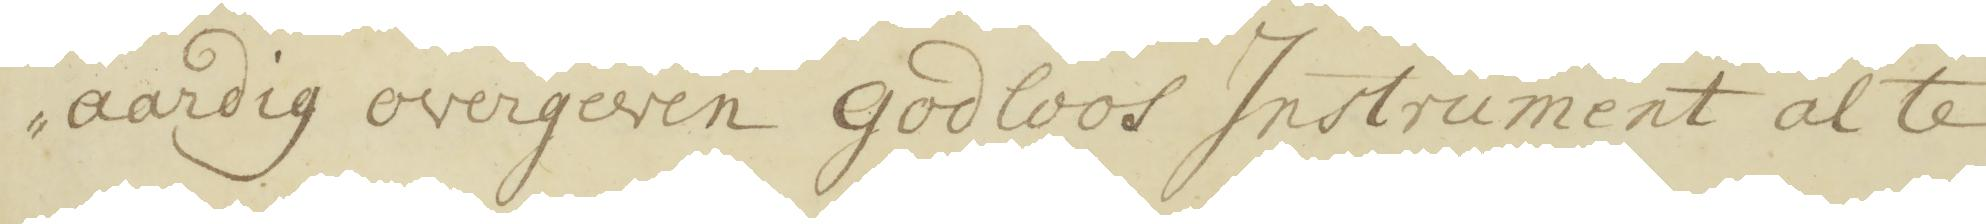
„aardig overgeven godloos Jnstrument al te
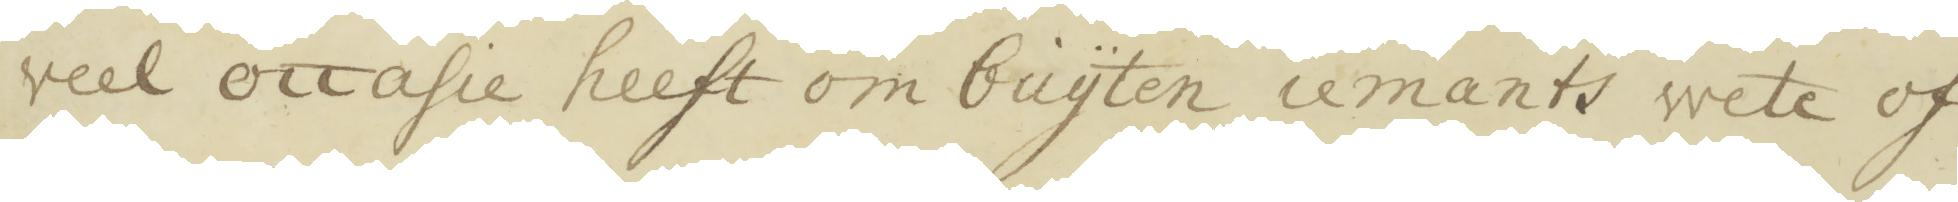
veel occasie heeft om buijten iemants wete of
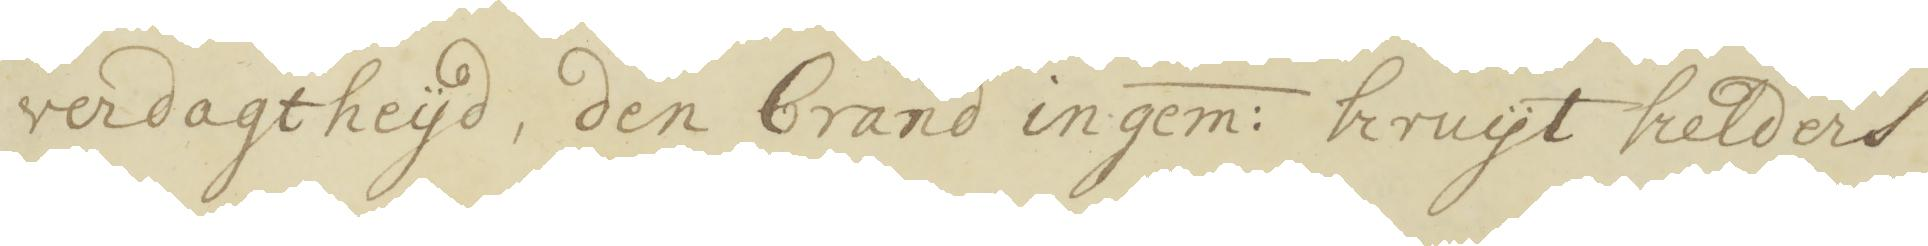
verdagtheijd, den brand in gem: kruijt kelders
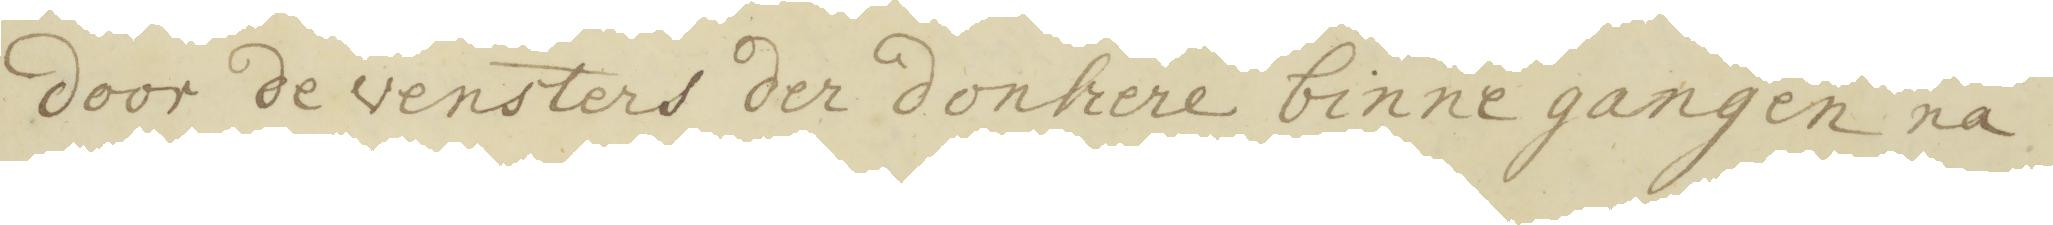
door de vensters der donkere binne gangen na
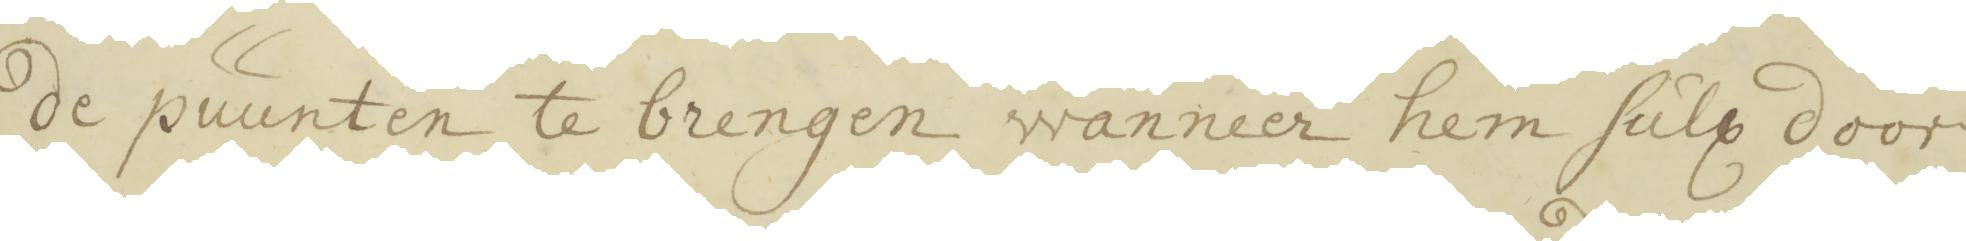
de puunten te brengen wanneer hem sulx door
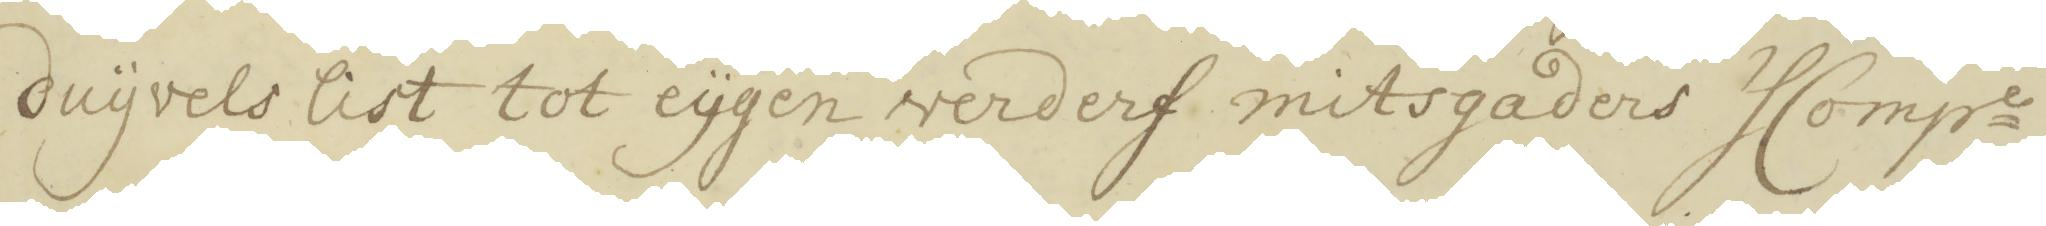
duijvels list tot eijgen verderf mitsgaders 'SComp=e
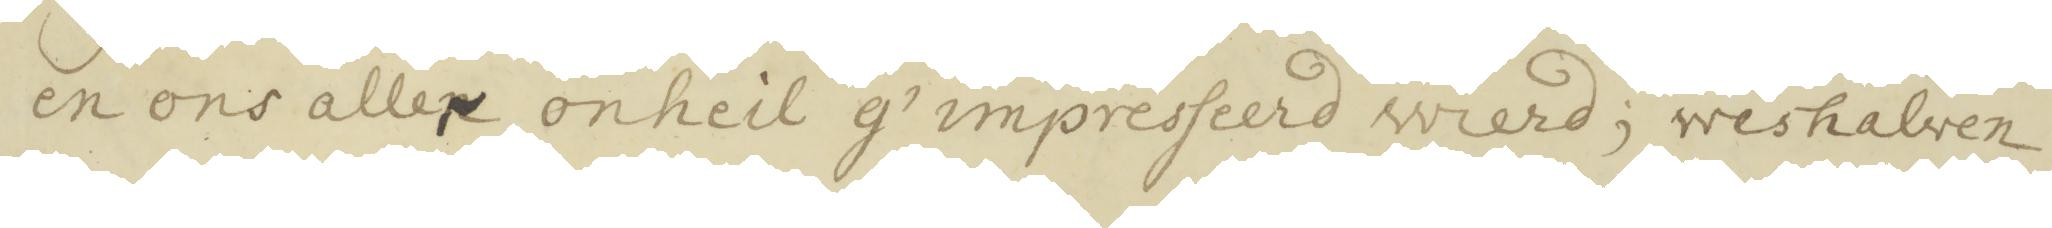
en ons aller onheil g’impresseerd wierd; weshalven
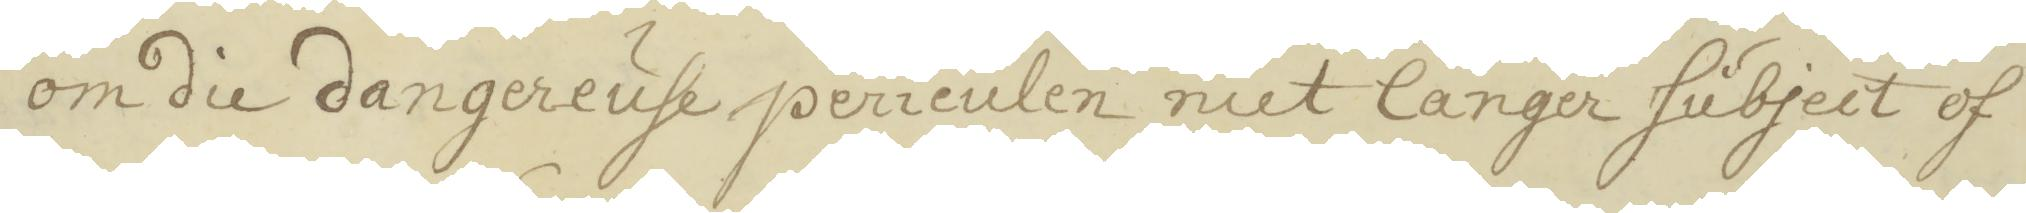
om die dangereuse periculen niet langer Subject of
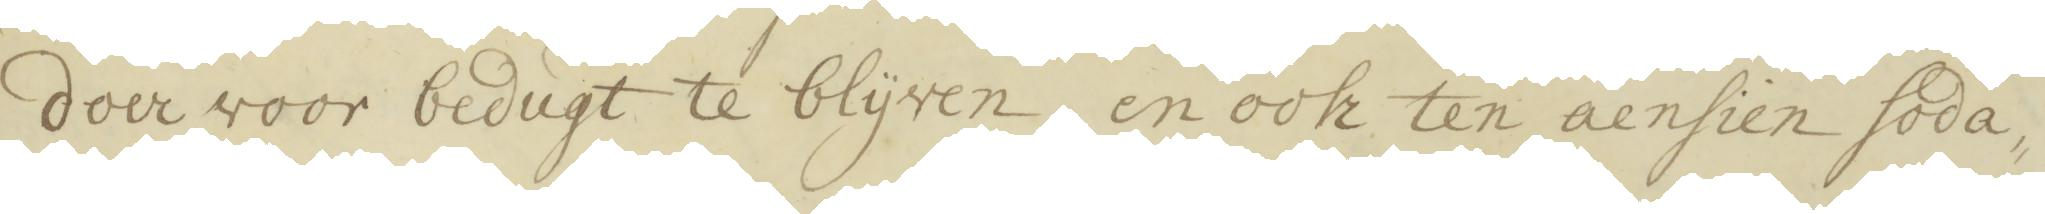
daer voor bedugt te blijven, en ook ten aensien Soda„
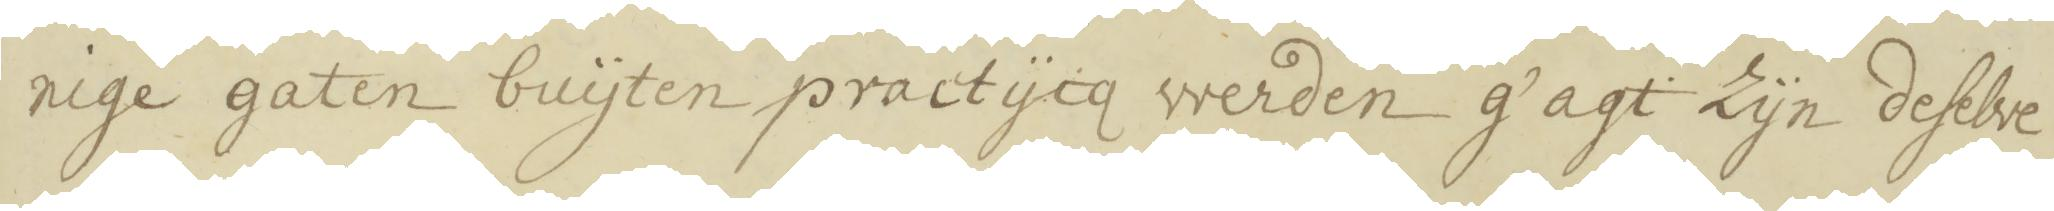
rige gaten buijten practijcq werden g’agt Zijn deselve
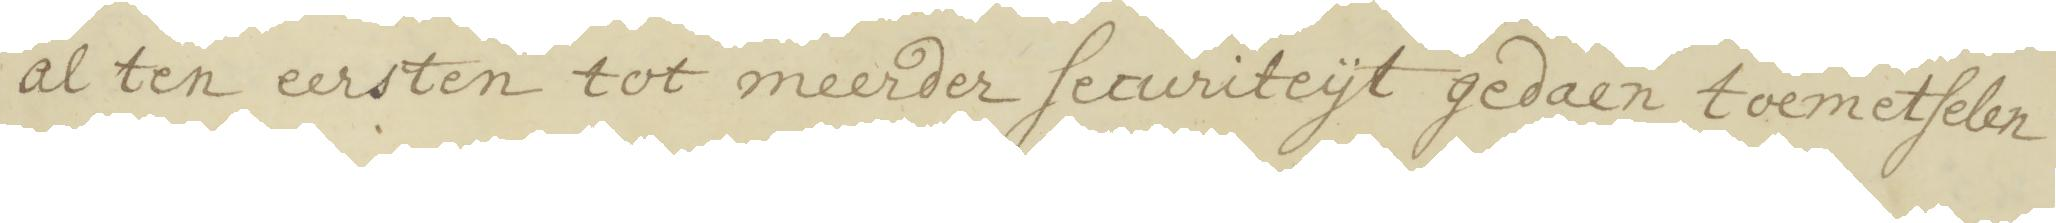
al ten eersten tot meerder Securiteijt gedaen toemetselen
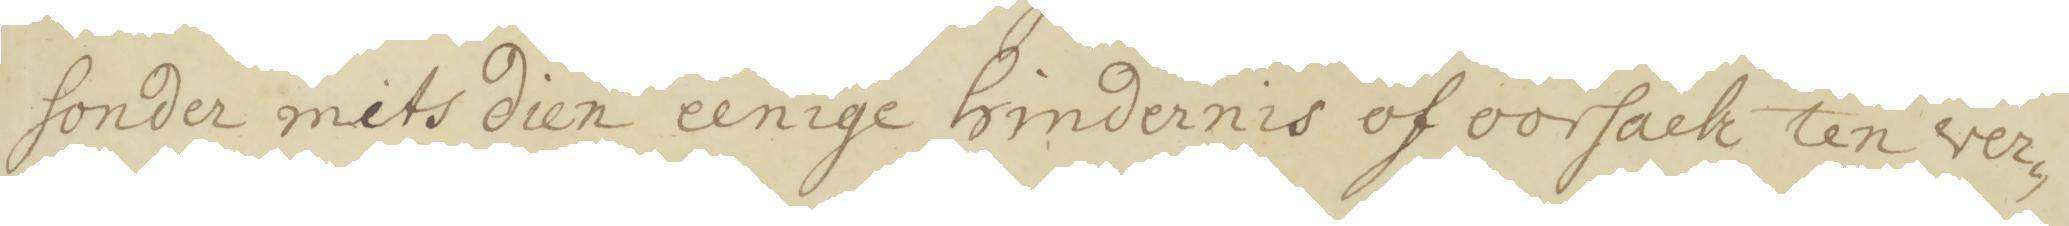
Sonder mits dien eenige hindernis of oorsaek ten ver„
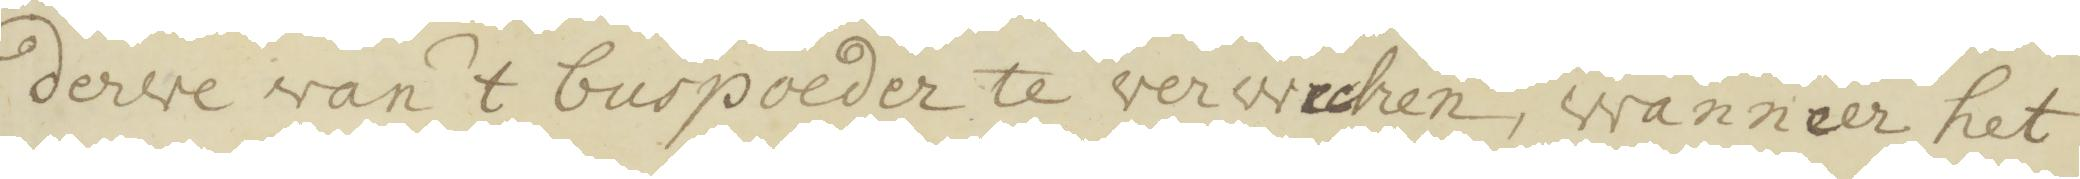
derve van ’t buspoeder te verwecken, wanneer het
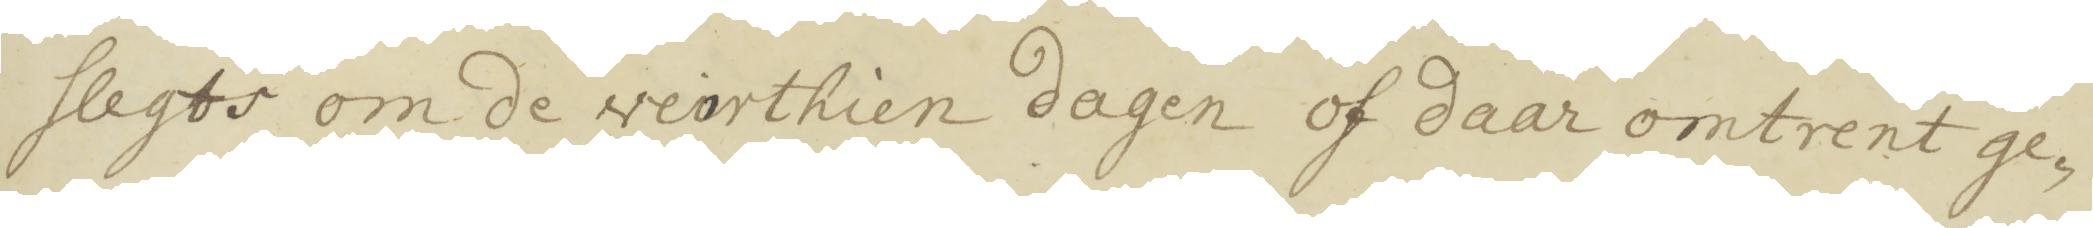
Slegts om de vierthien dagen of daar omtrent ge„
